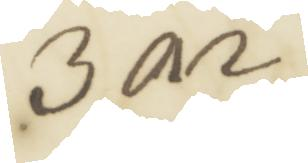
342
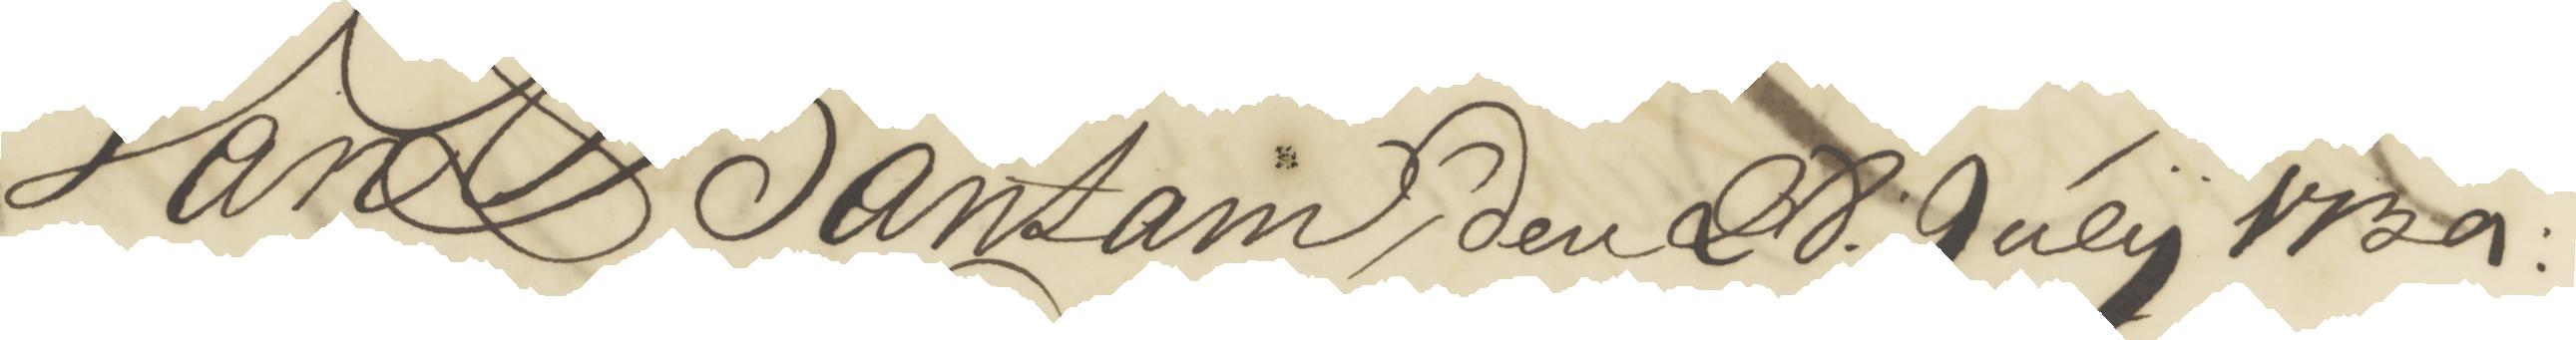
Van Bantam, den 28: Julij 1734:
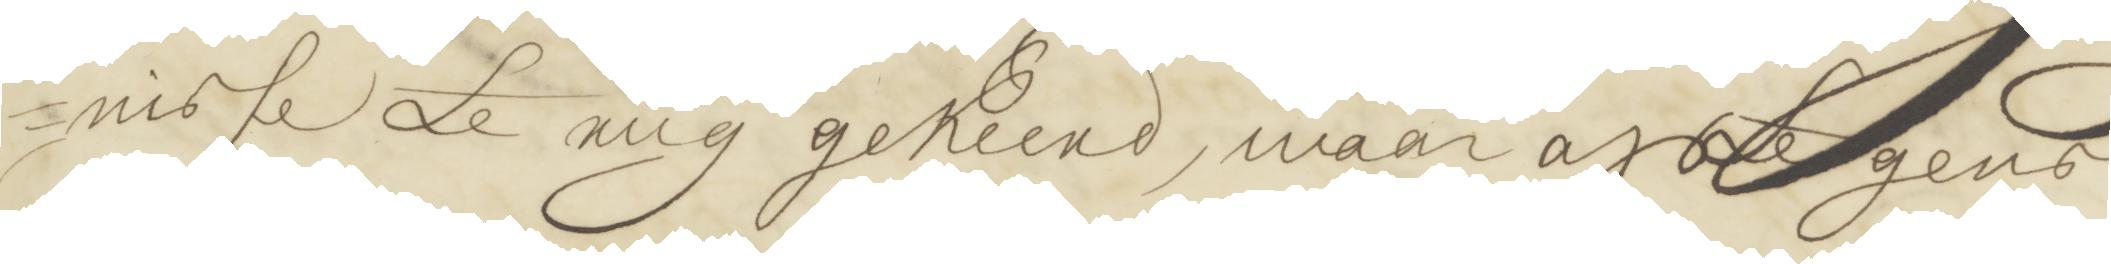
=isse te rug gekeerd, waar op tegens
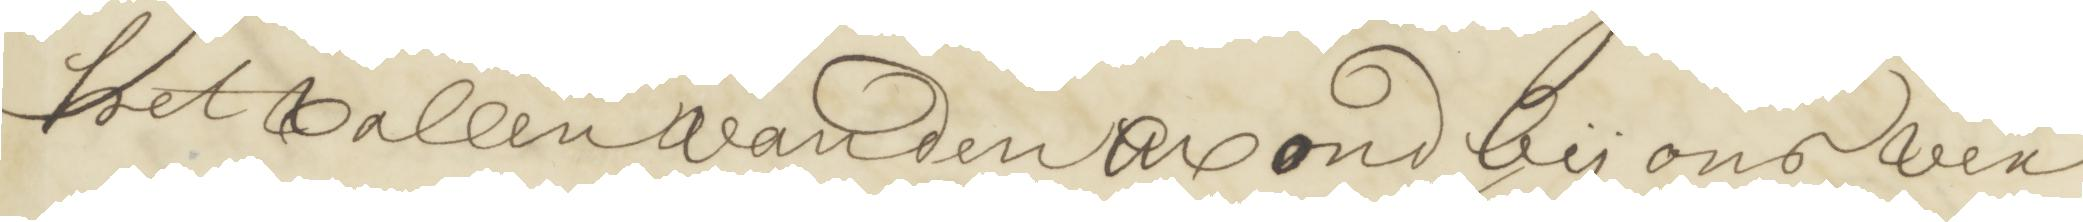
het vallen vanden avond bij ons ver
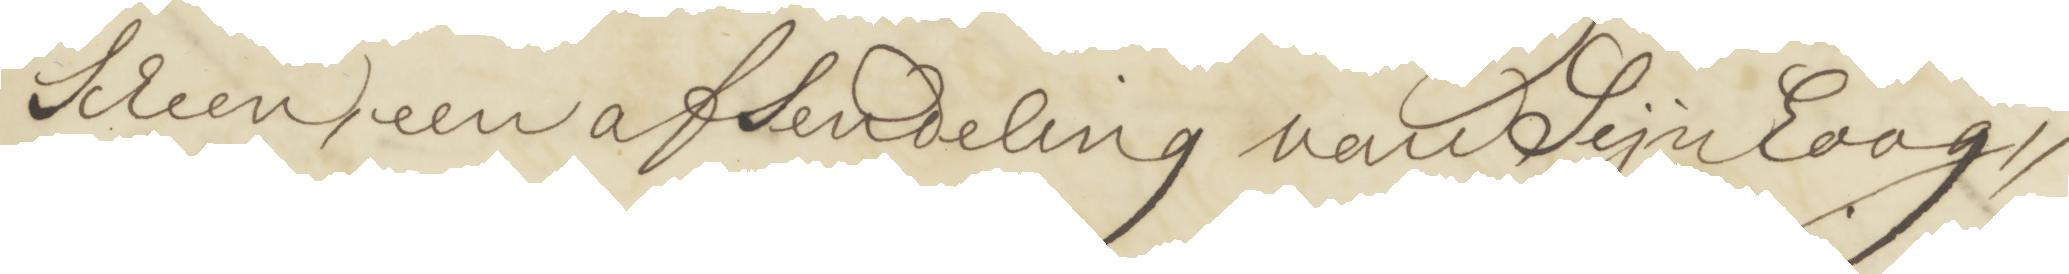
scheen, een afsendeling van Sijn hoog„
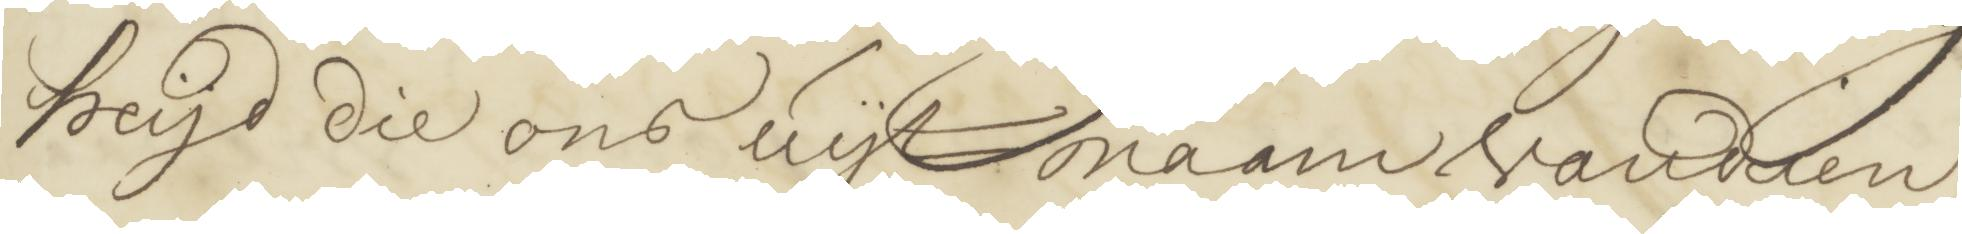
heijd die ons uijt naam van dien
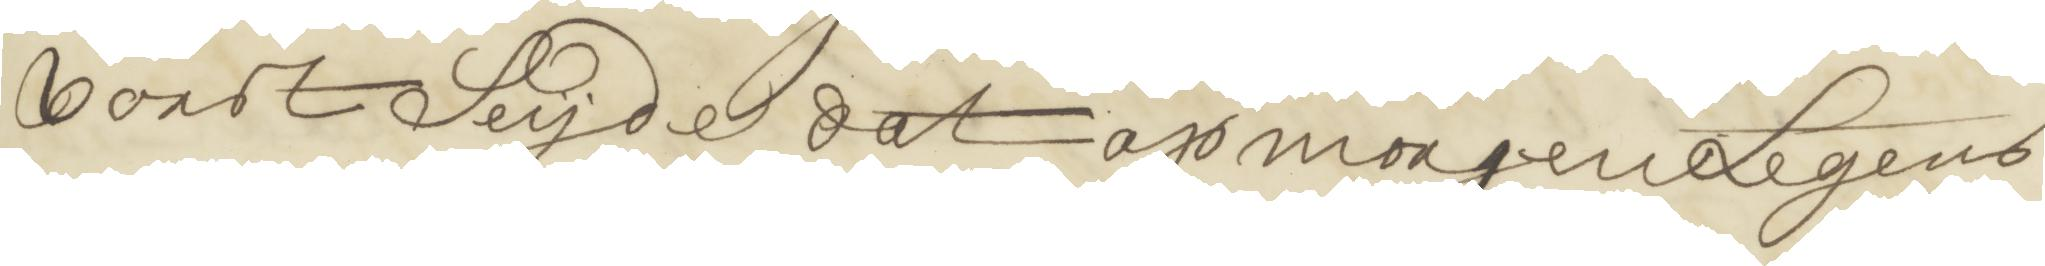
vorst Seijde dat op morgen tegens
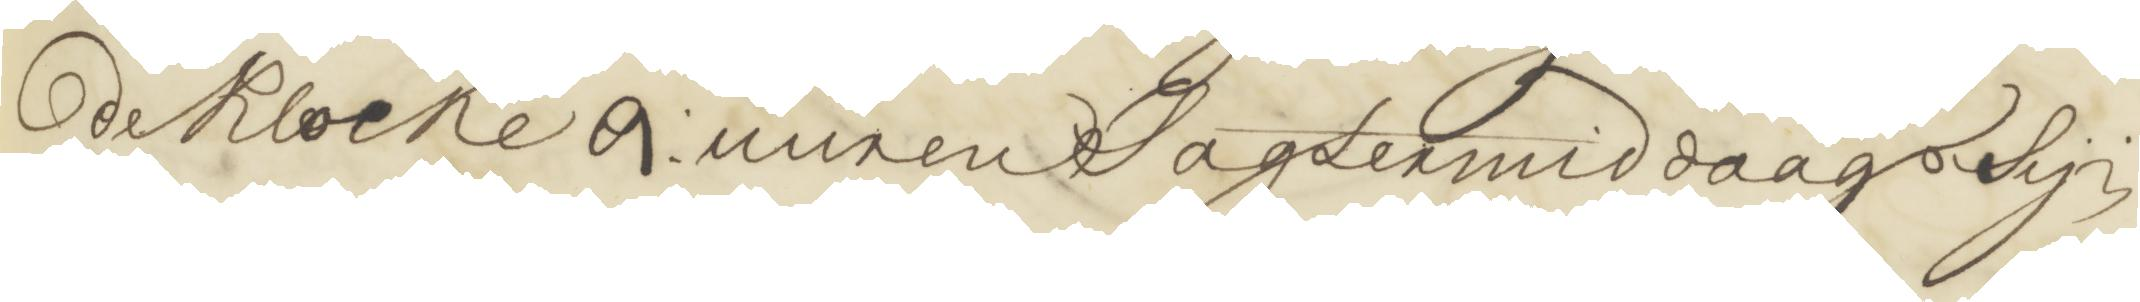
de klocke 4: uuren 'S agtermiddaags Sijn
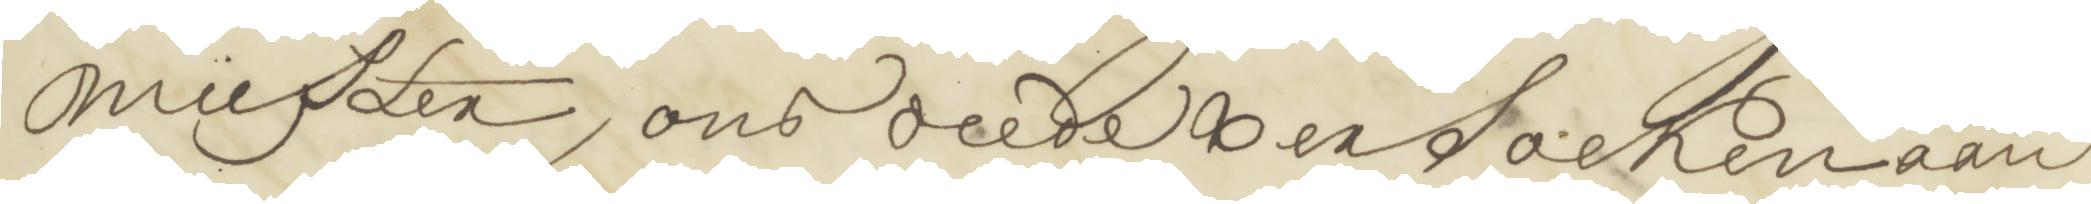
meester, ons deede versoeken aan
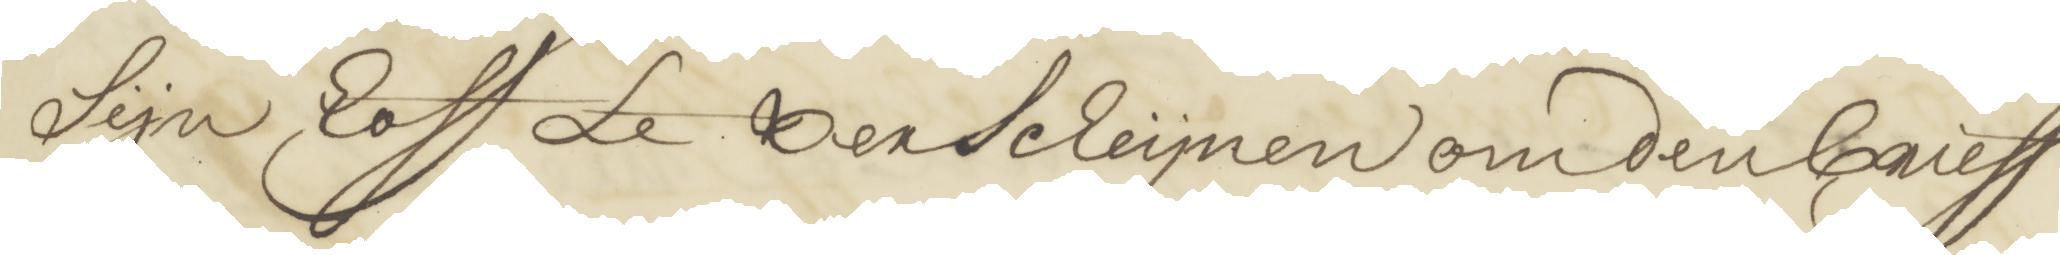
Sijn hoff te verscheijnen om den brieff
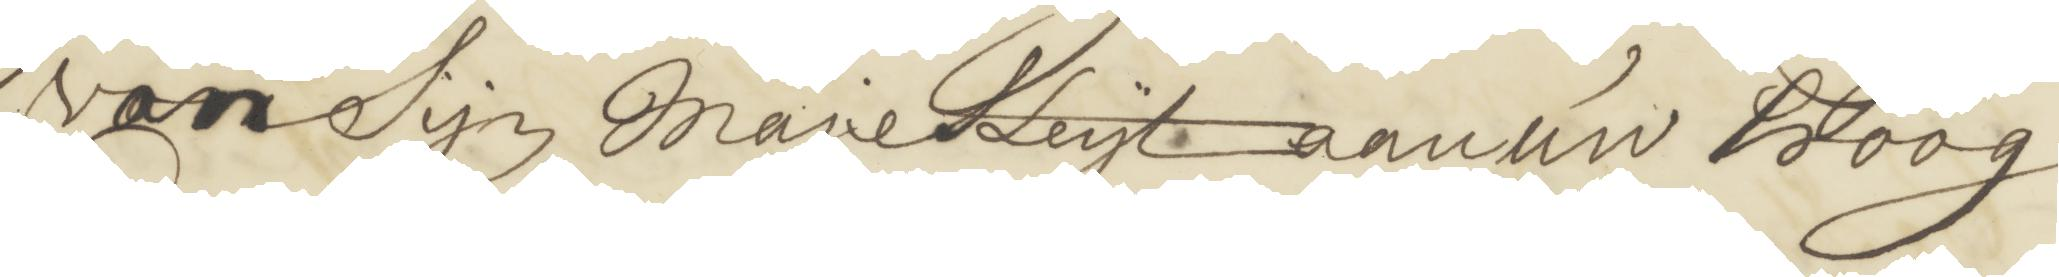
van Sijn majesteijt aan uw hoog
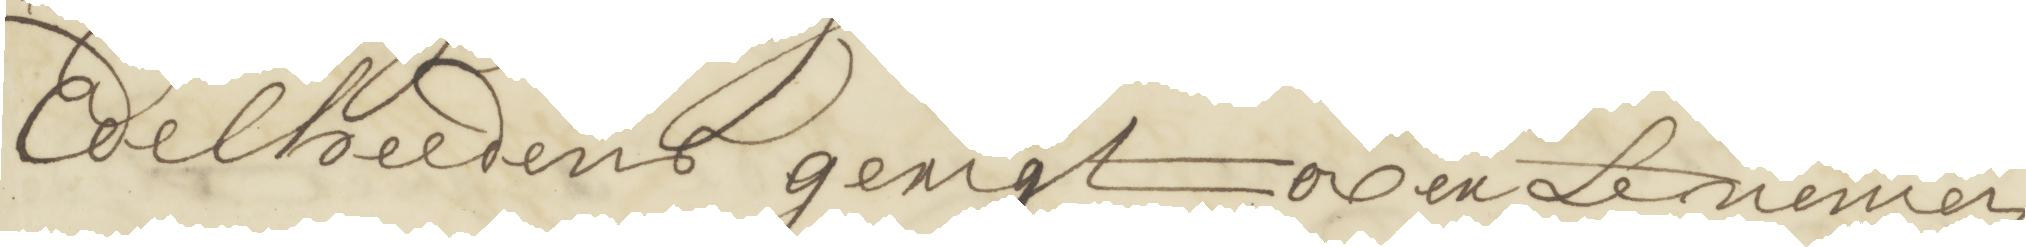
Edelheedens gerigt over te nemen
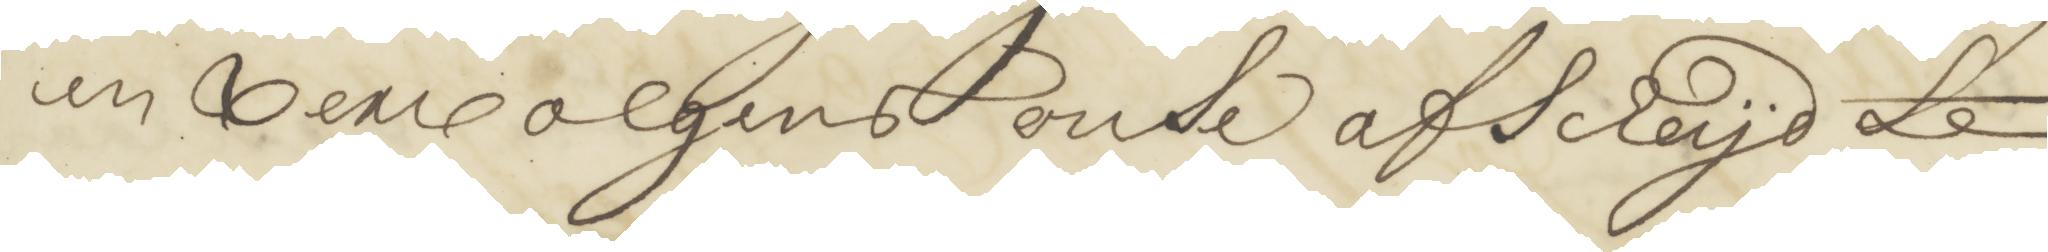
en vervolgens onse afscheijd te
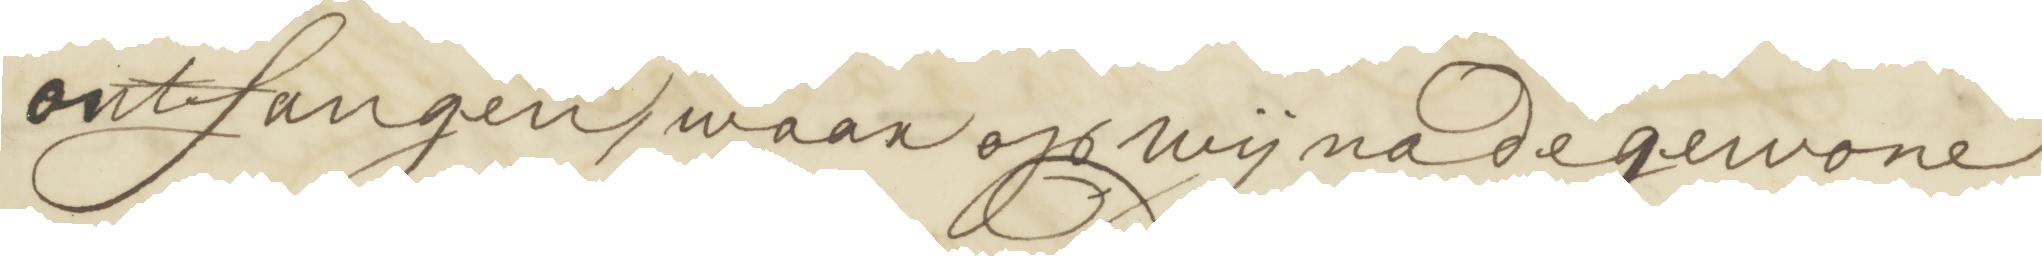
ontfangen, waar op wij na de gewone
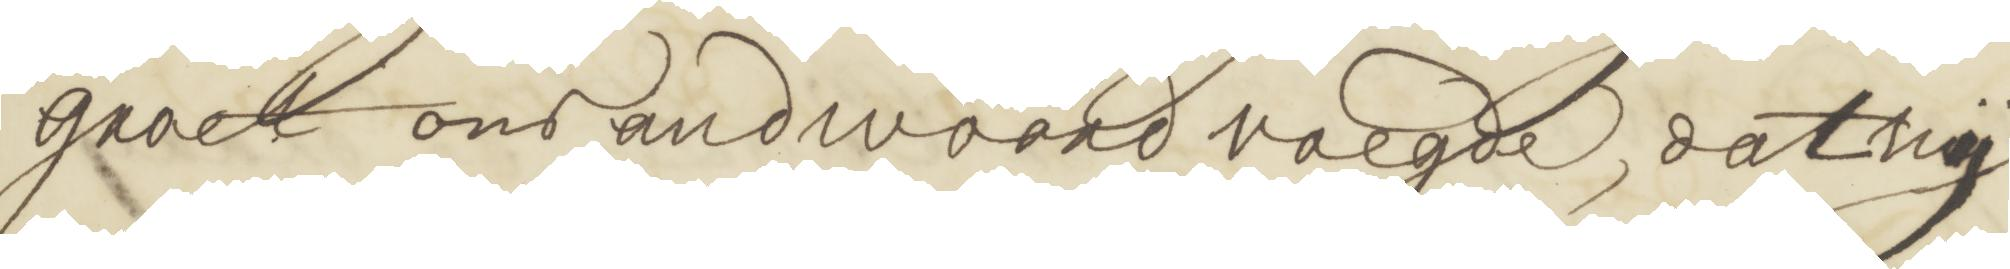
groet ons andwoord voegde, dat wij
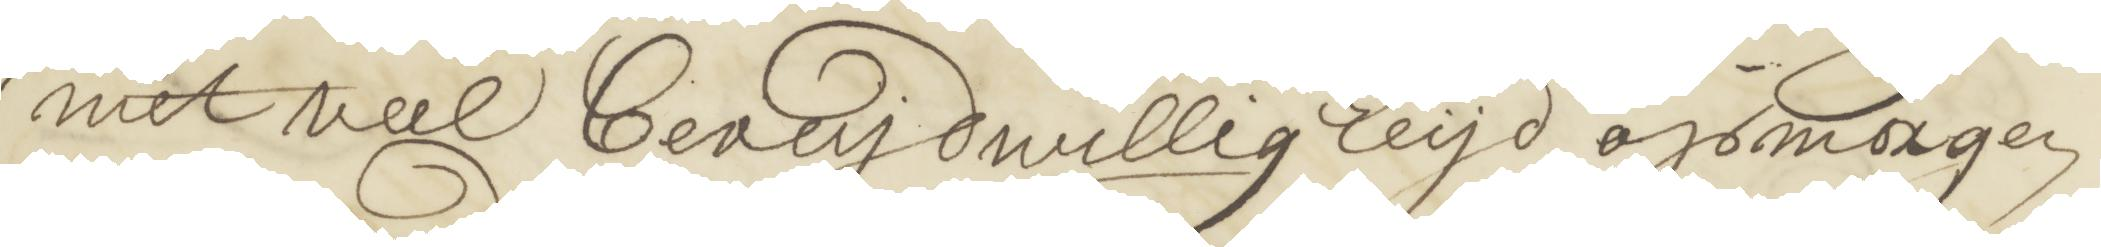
met veel bereijdwilligheijd op morgen
